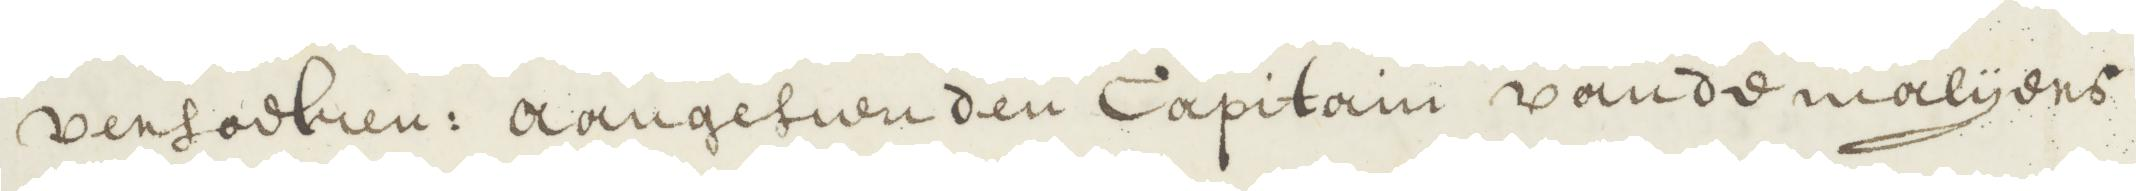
versoeken: aangesien den Capitain van de malijers
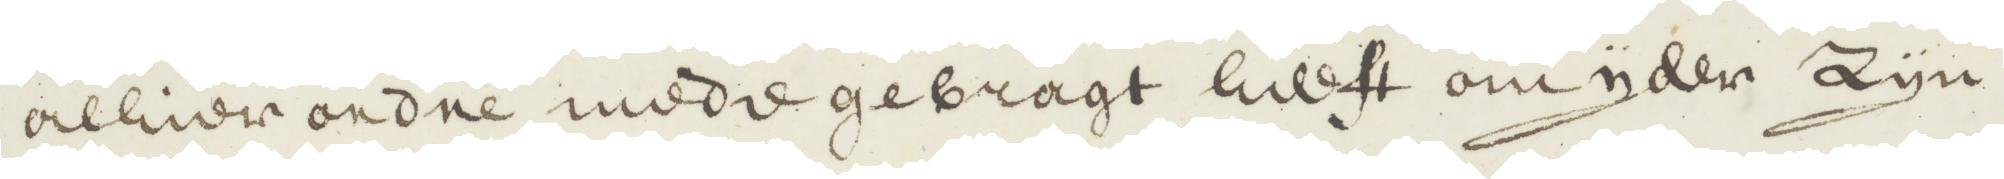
alhier ordre mede gebragt heeft om ijder zijn
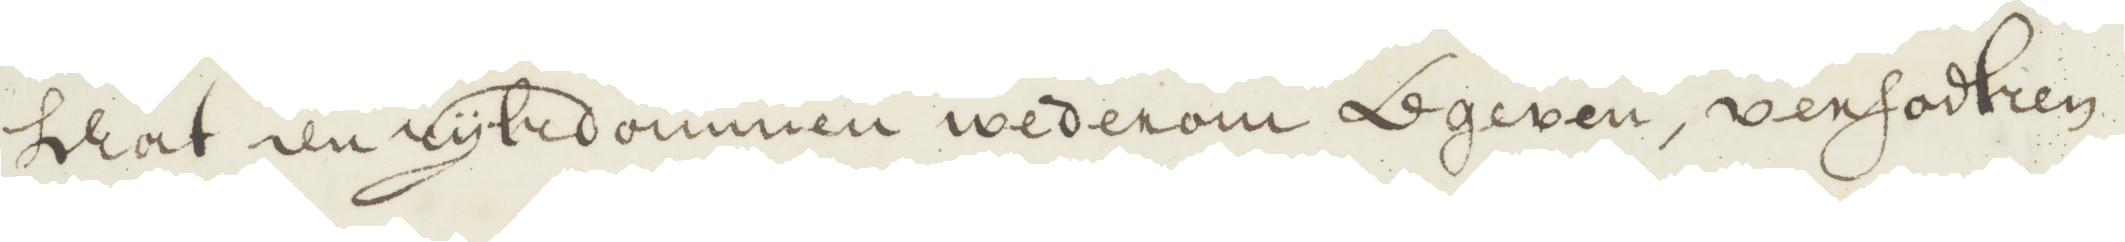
schat en rijkdommen wederom te geven, versoeken
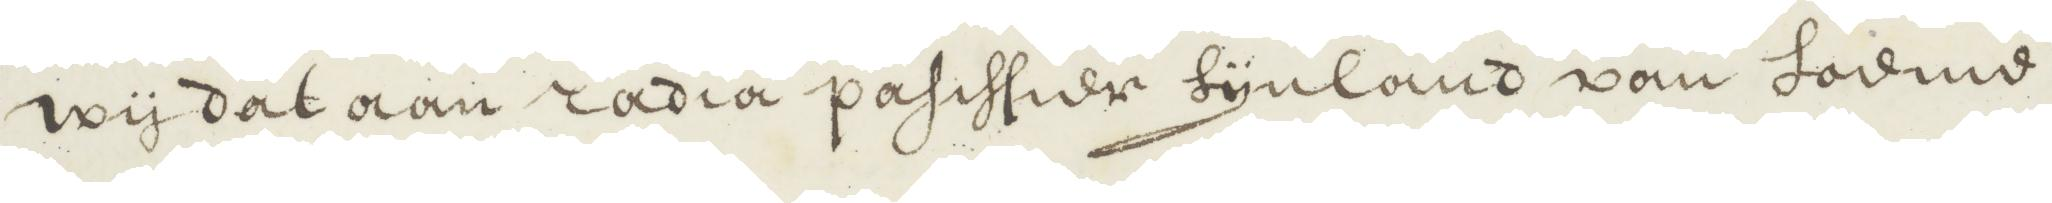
wij dat aan radia pasissier sijnland van soeme
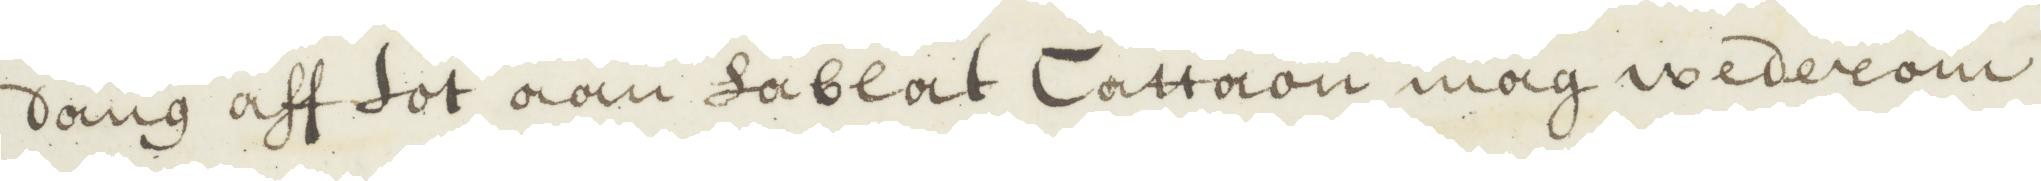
dang aff tot aan hablat Cattaon mag wederom
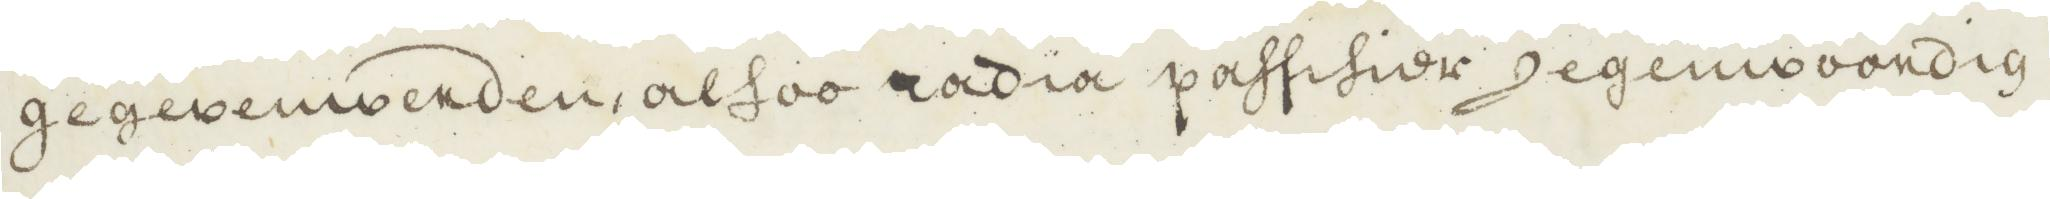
gegevenwerden, alsoo radia passisier jegenwoordig
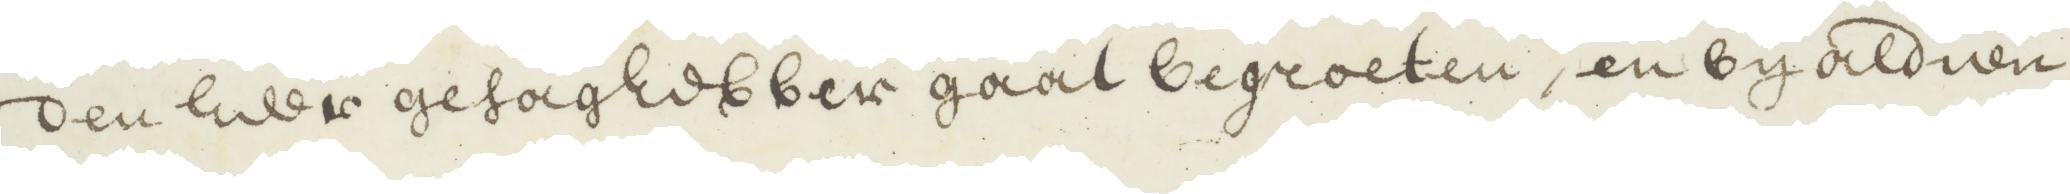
den heer gesaghebber gaat begroeten, en bij aldien
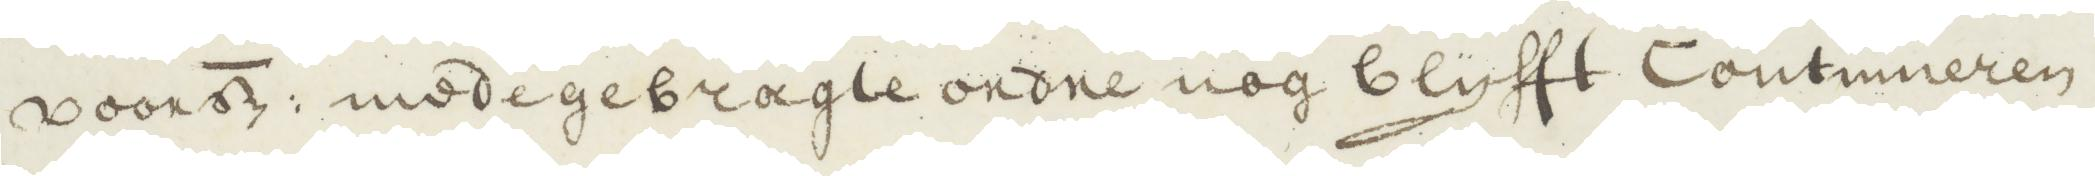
voorsz: mede gebragte ordre nog blijfft continueren
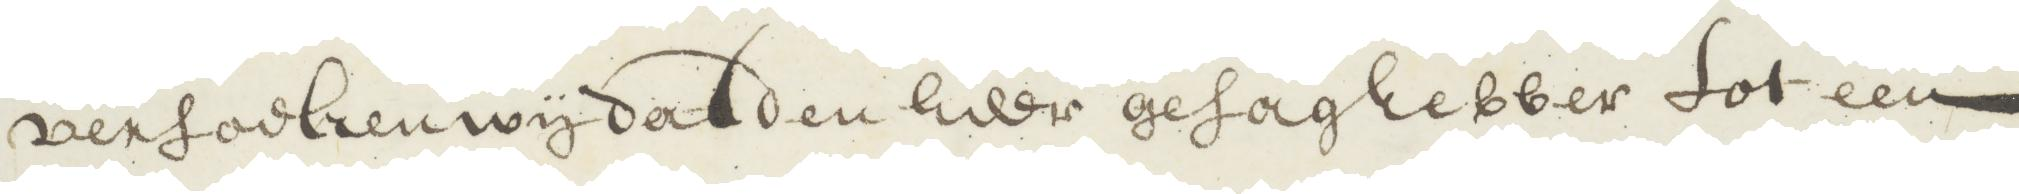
versoeken wij dat den heer gesaghebber tot een
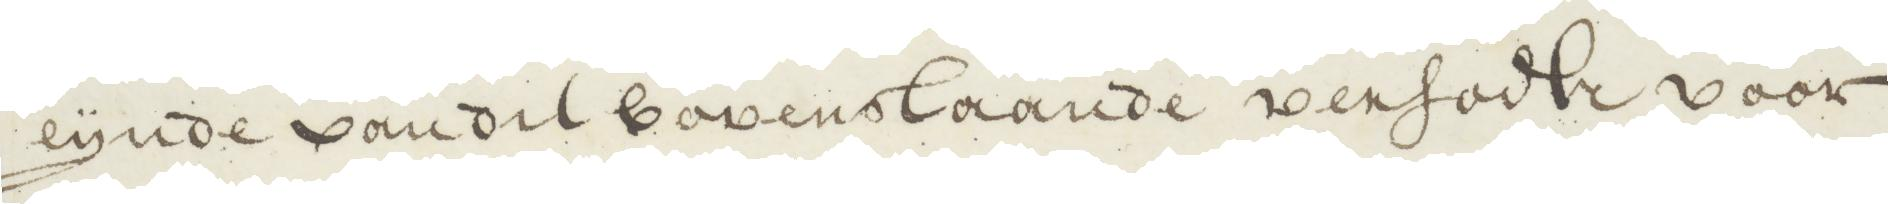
eijnde van dit bovenstaande versoek voor
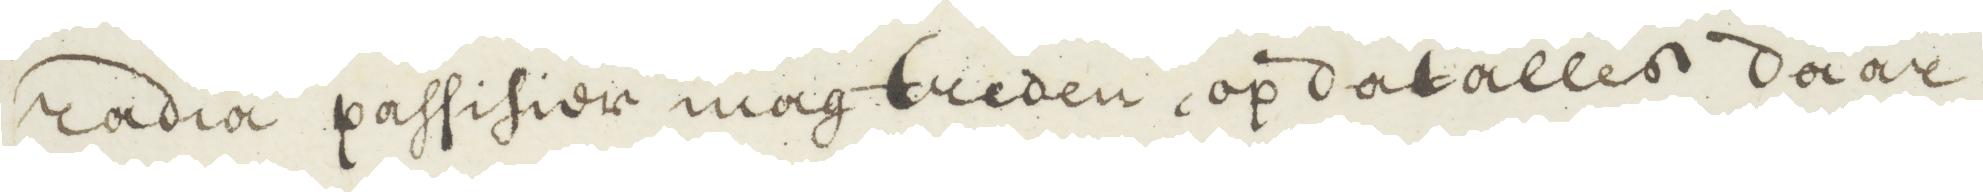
radia passisier mag treden, op dat alles daar
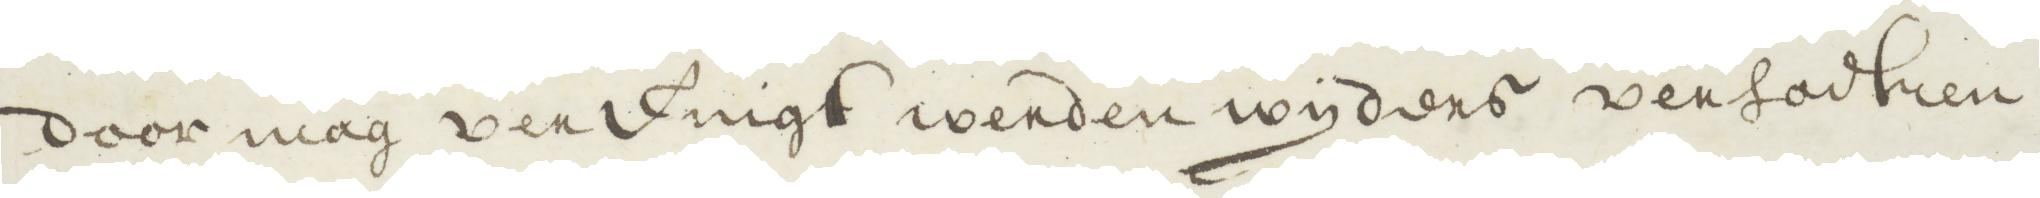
door mag ver Enigt werden wijders versoeken
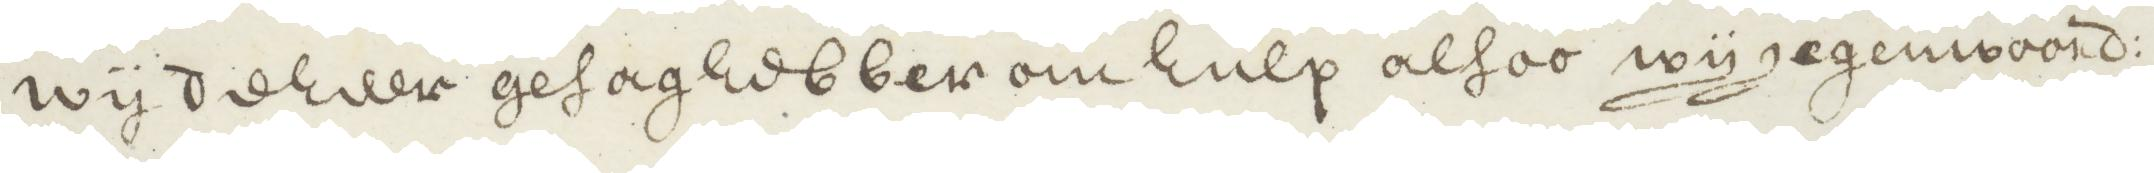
wij de heer gesaghebber om hulp alsoo wij jegenwoord:e
